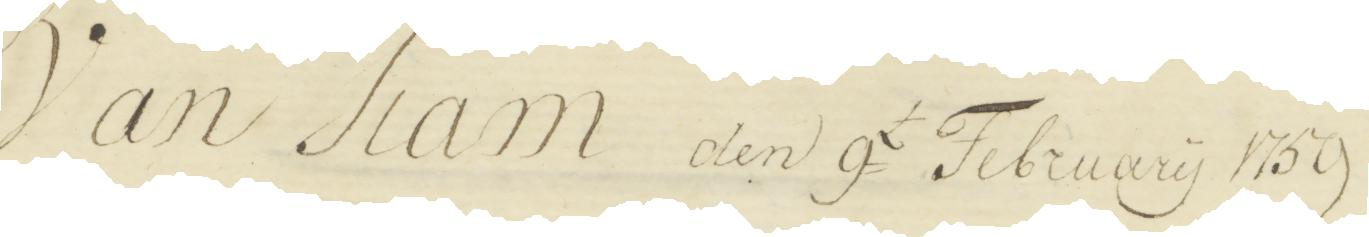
Van Siam den 9=t Februaij 1759
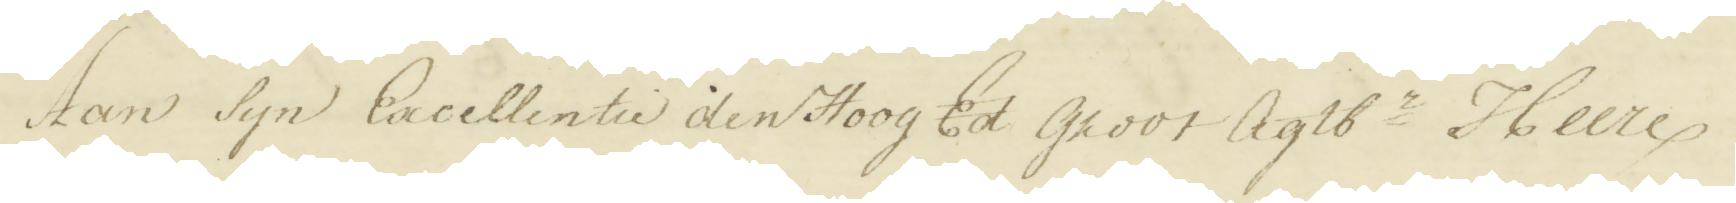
Aan sijn Excellentie den Hoog Ed Groot Agtb=r Heere
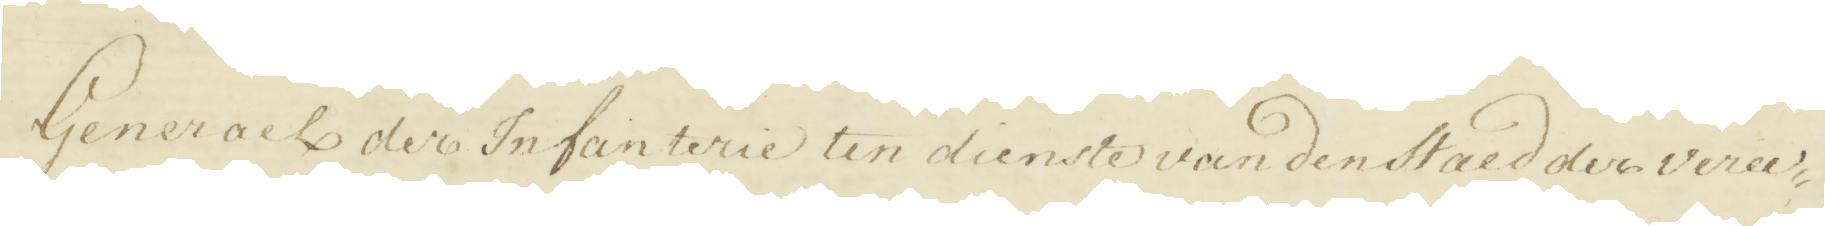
Generael der Infanterie ten dienste van den staed der veren„
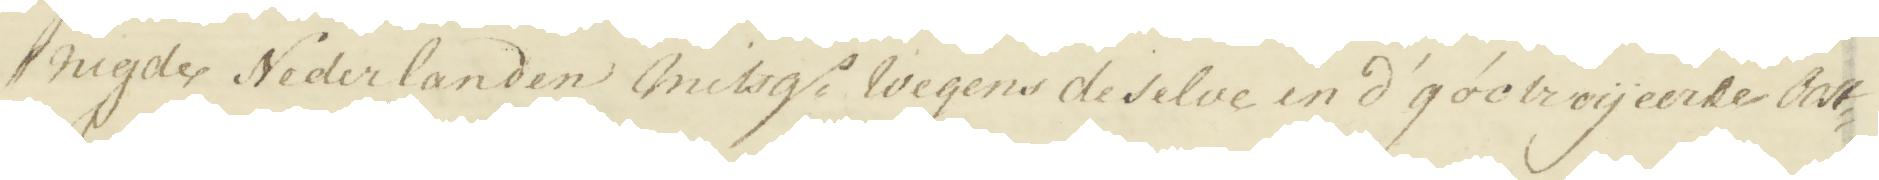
„nigde Nederlanden mitsg. wegens deselve in d’ g'octroijeerde Oost„
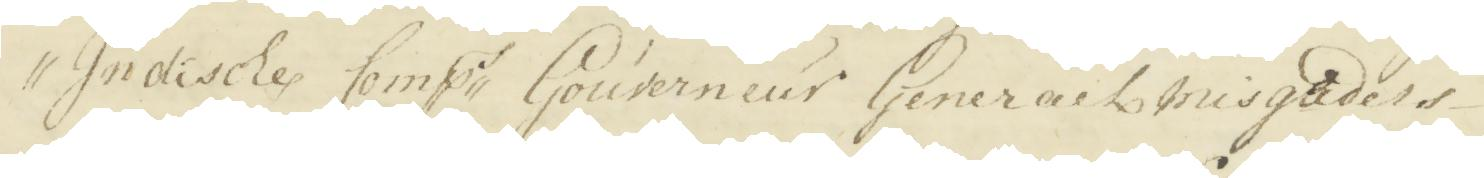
„Indische Comp„s Gouverneur Generael misgaders
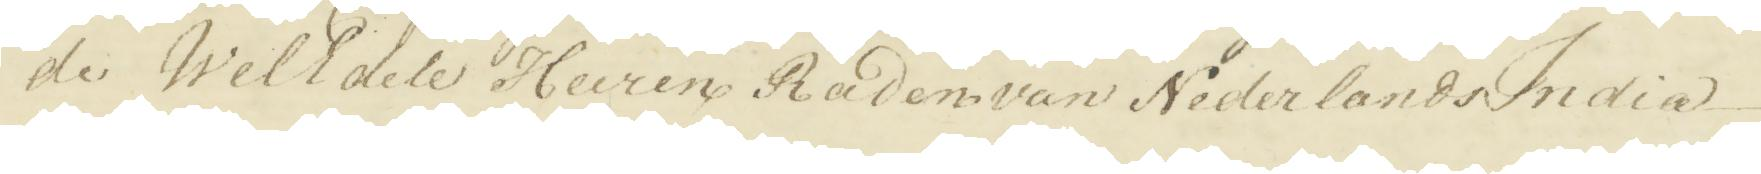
de WelEdele Heeren Raden van Nederlands India
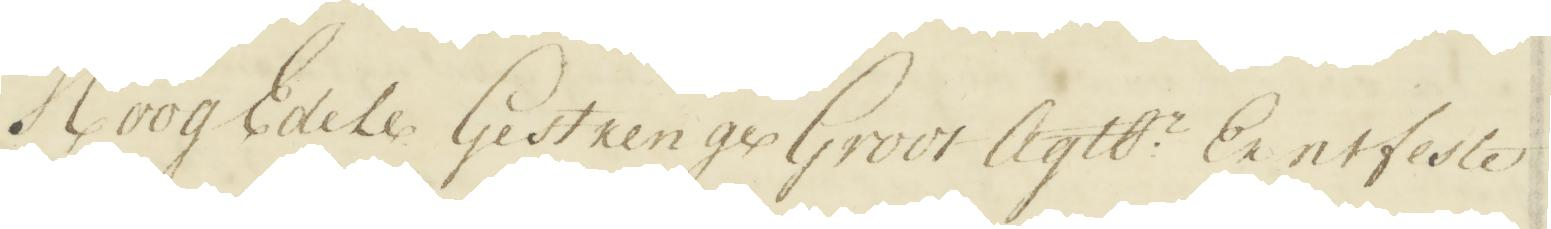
Hoog Edele Gestrenge Groot Agtb:r Erntfeste
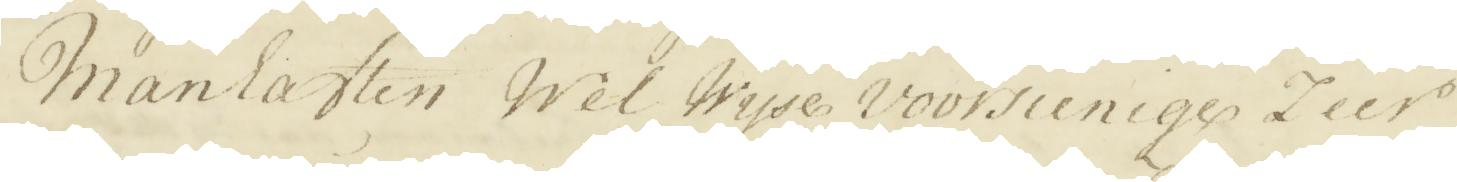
manhaften wel wyse voorsienige zeer
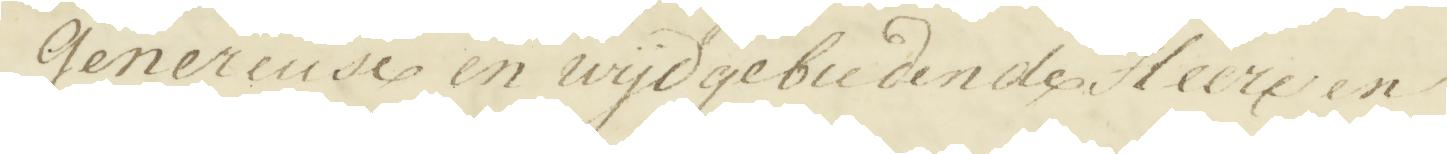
Genereuse en wijd gebiedenden Heere en
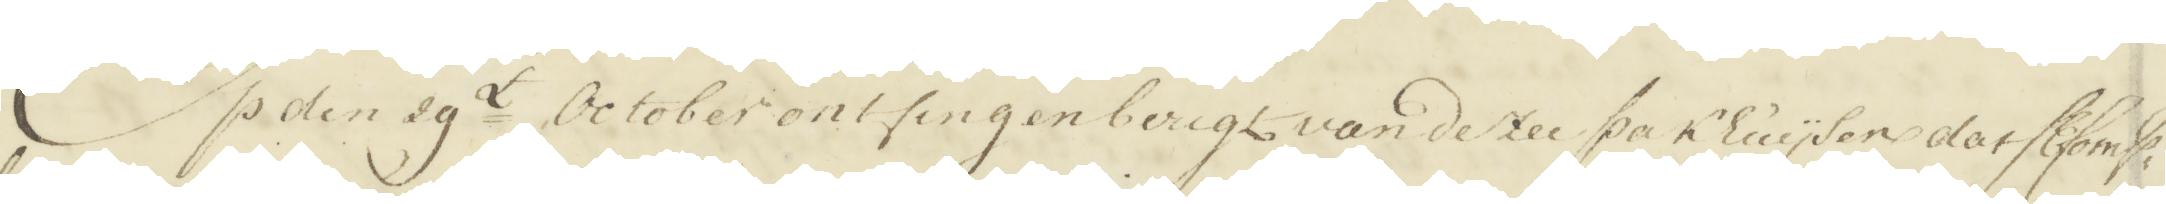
Op den 29=t October ontfingen berigt van de zee pakhuijsen dat SE Comp=s
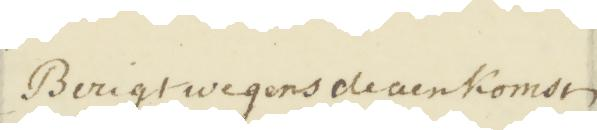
Berigt wegens de aenkomst
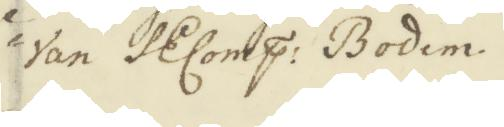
van SE Comp: Bodem.
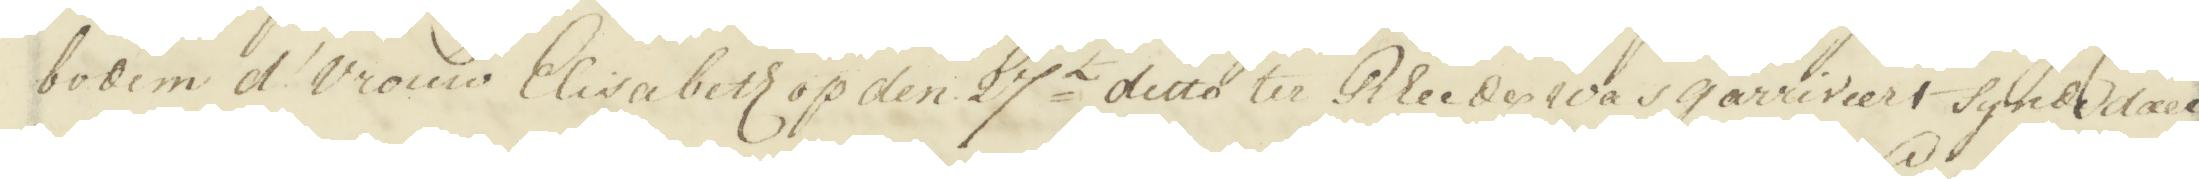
bodem d’ vrouw Elisabeth op den 27=t ditto ter Rheede was g'arriveert sijnde daer
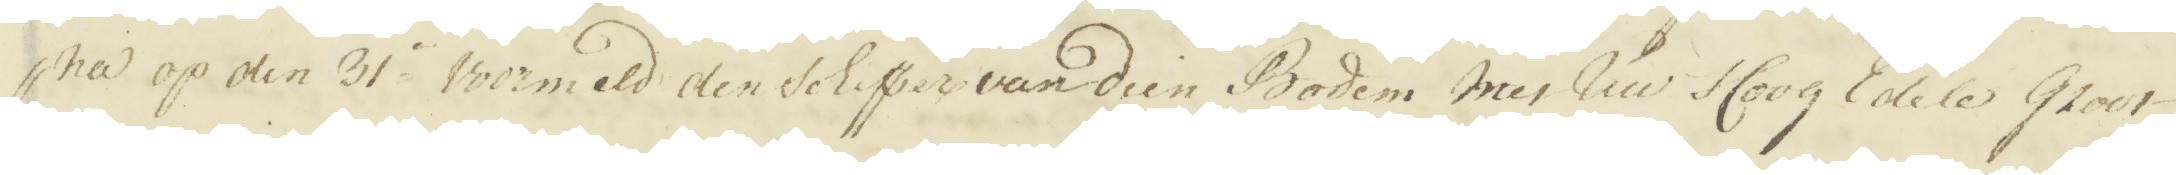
„na op den 31:e voormeld der schipper van dien Bodem met uw Hoog Edele Groot
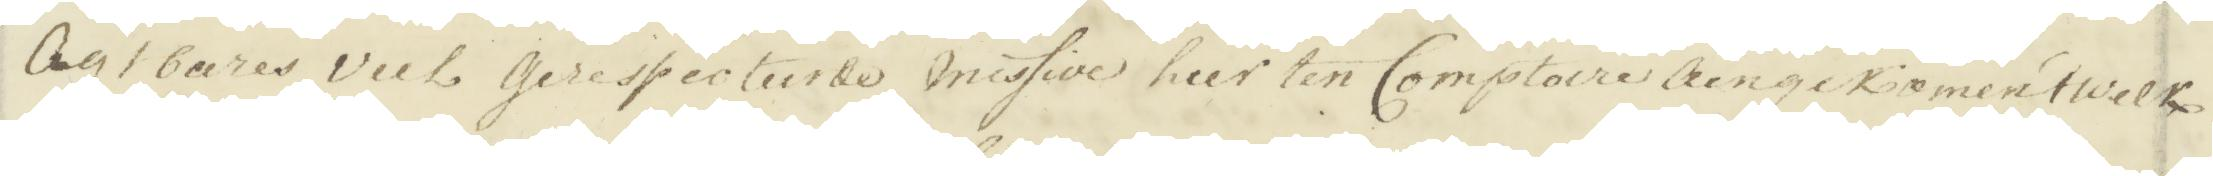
Agtbares veel gerespecteerde missive hier ten comptoire aengekomen 'twelk
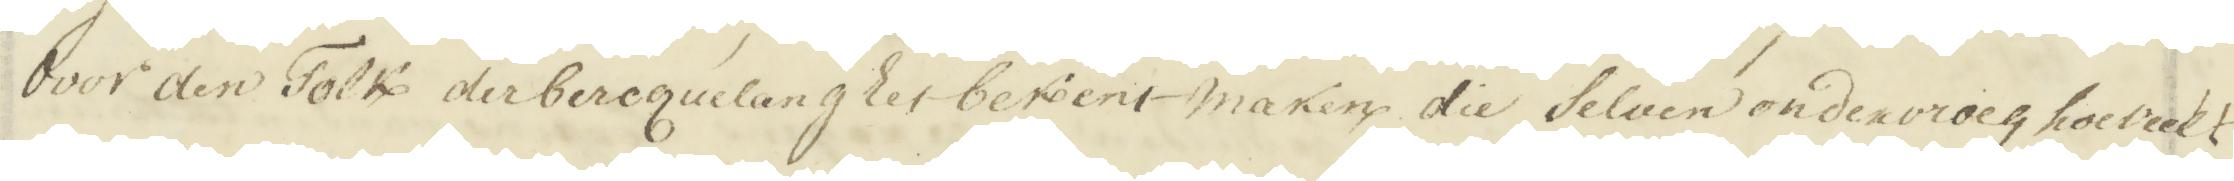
door den tolk derbercquelang het bekent maken die selven ondervroeg hoeveel 't
